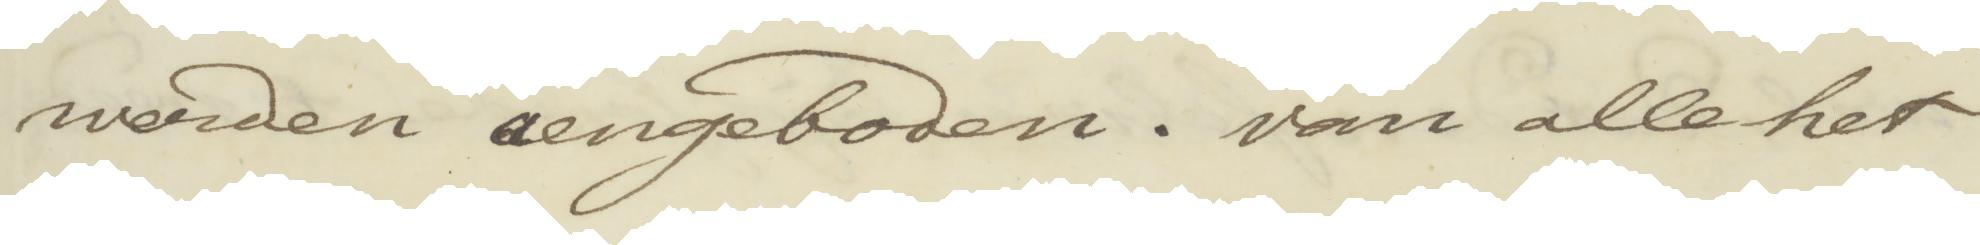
werden aengeboden. van alle het
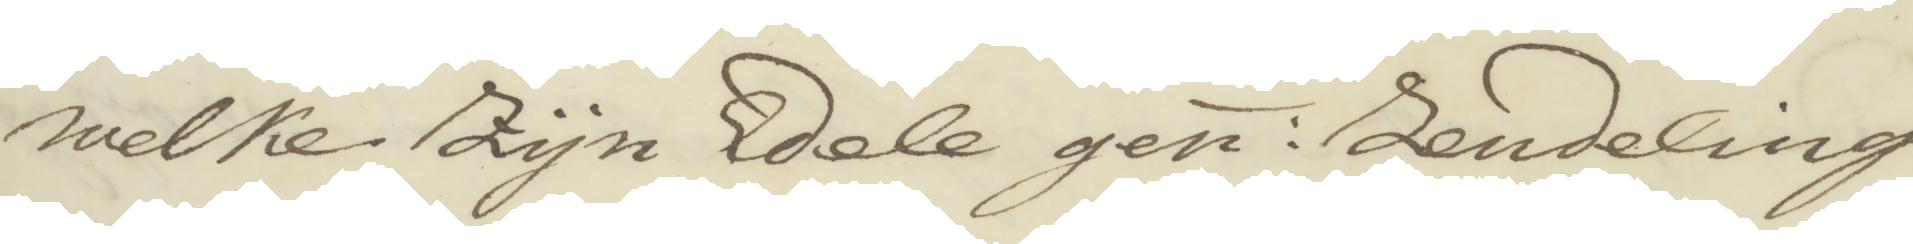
welke zijn Edele gen: zendeling
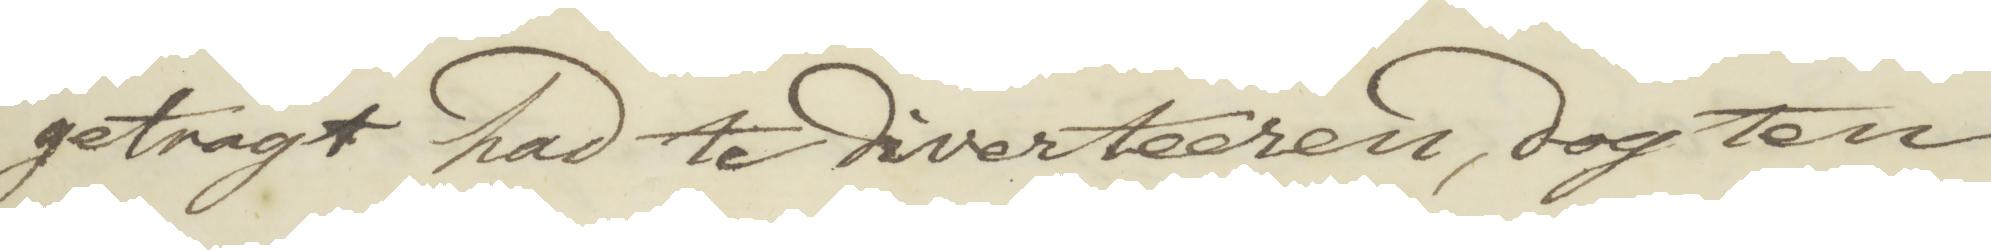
getragt had te diverteeren, dog ten
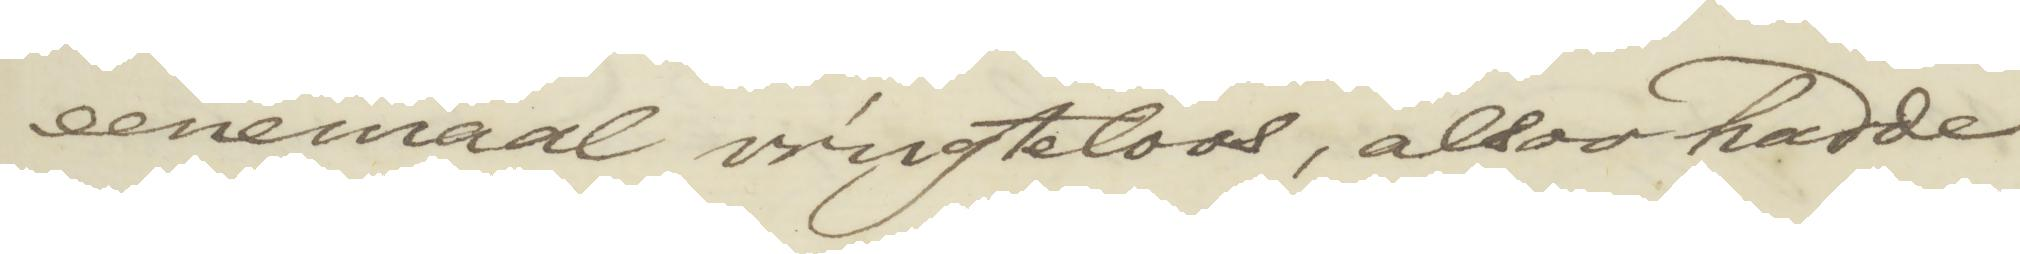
eenemaal vrugteloos, alsoo hadde
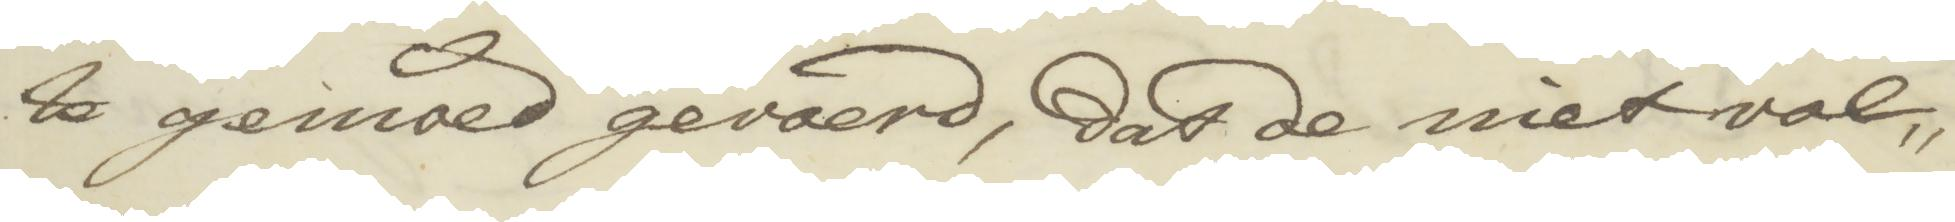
te gemoed gevoerd, dat de niet vol„
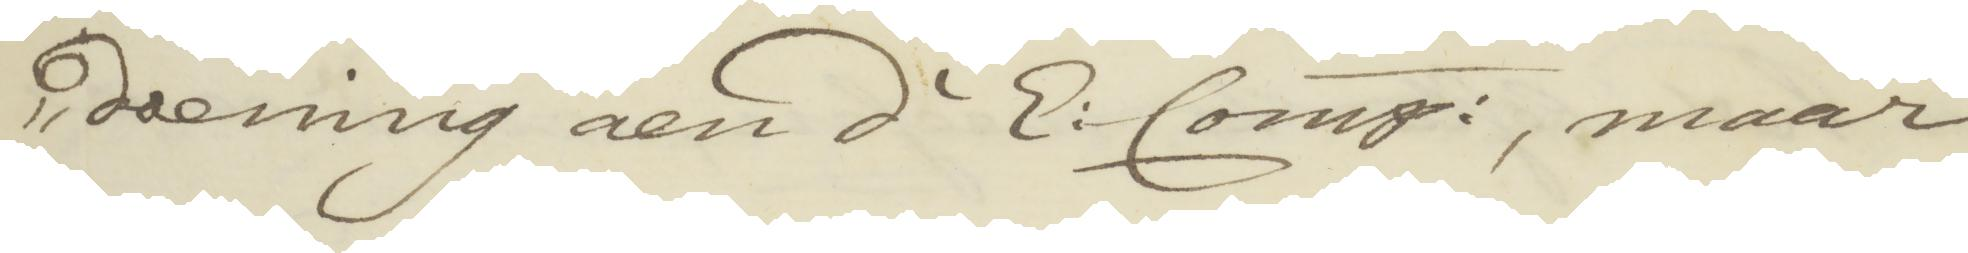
„doening aen d’ E: Comp:, maar
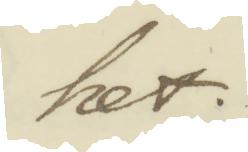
het.
